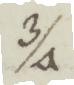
¾
